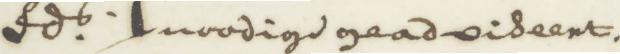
Ed.s 't noodige geadviseert.
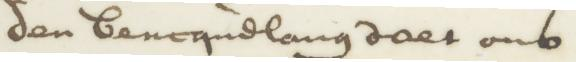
den bercquelang doet ons
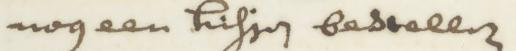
nog een kisjen bestellen
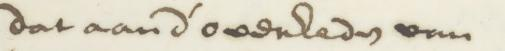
dat aan d’overheden van
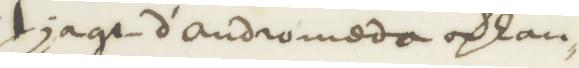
't jagt d'andromeda overhan„
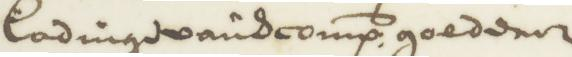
ladinge van 'Scomp:s goederen
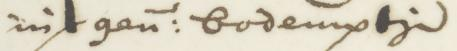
uit gen: bodemptje
